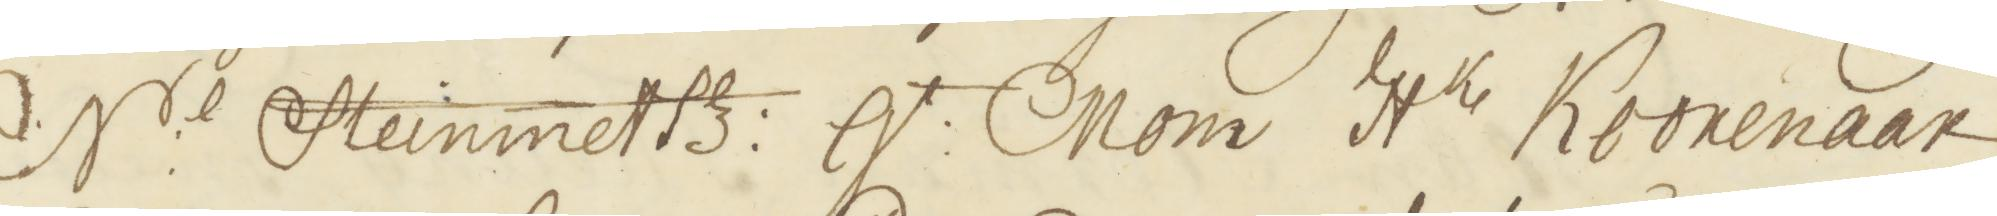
N:l Steinmetsz: G:t Mom Hk Koorenaar
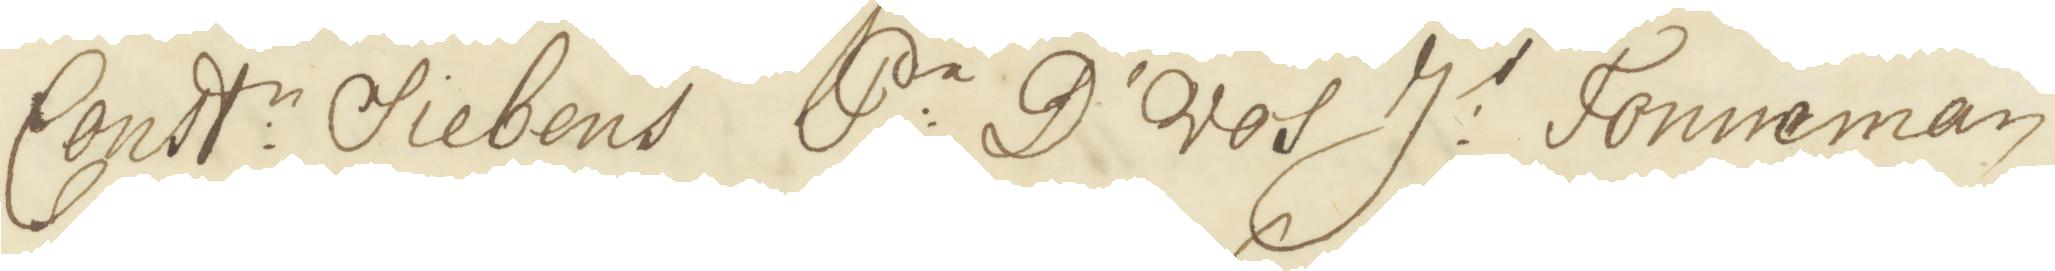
Const:n Siebens P:r D' Vos J:s Tonneman
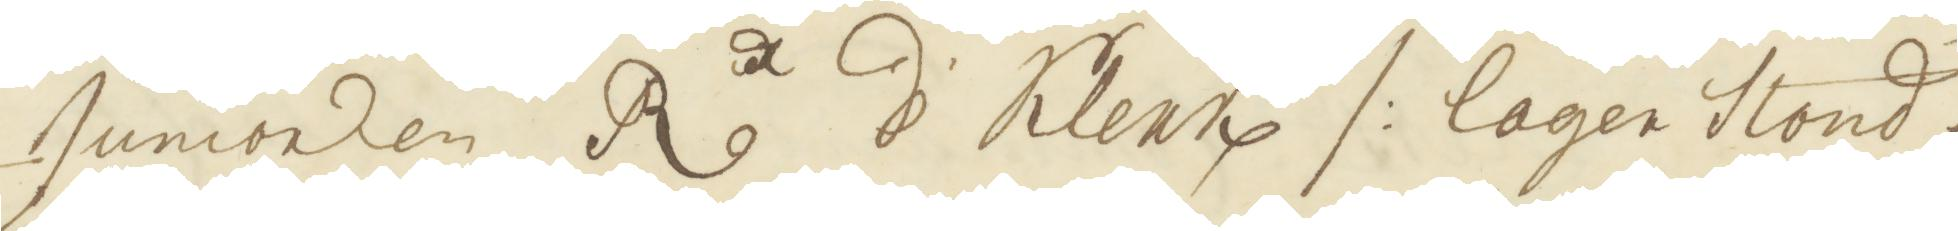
Junior den Rd d' Klerk /:lager stond:/
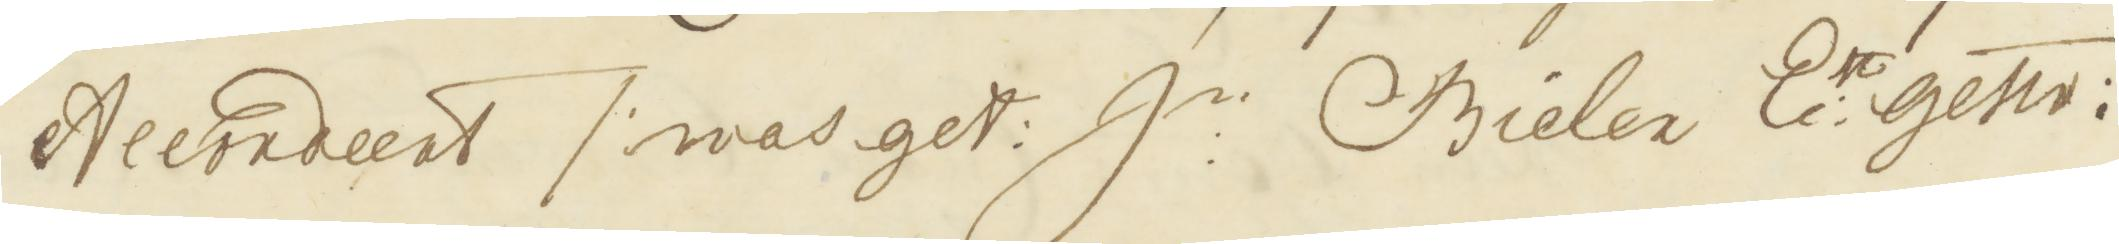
Accordeert /:was get: J:r Bieler E:st gesw
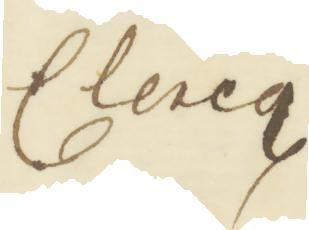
Clercq
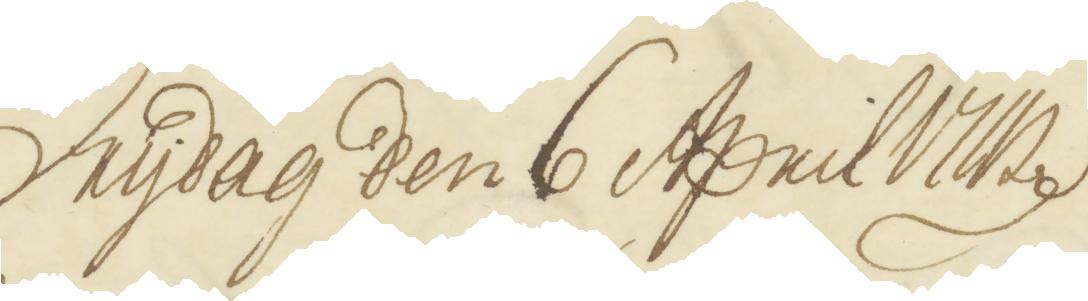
Vrijdag den 6 April 1742
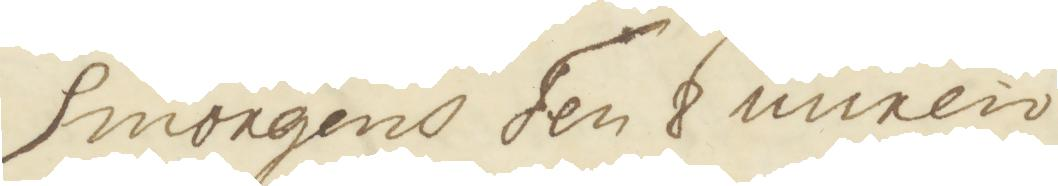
smorgens Ten 8 uuren
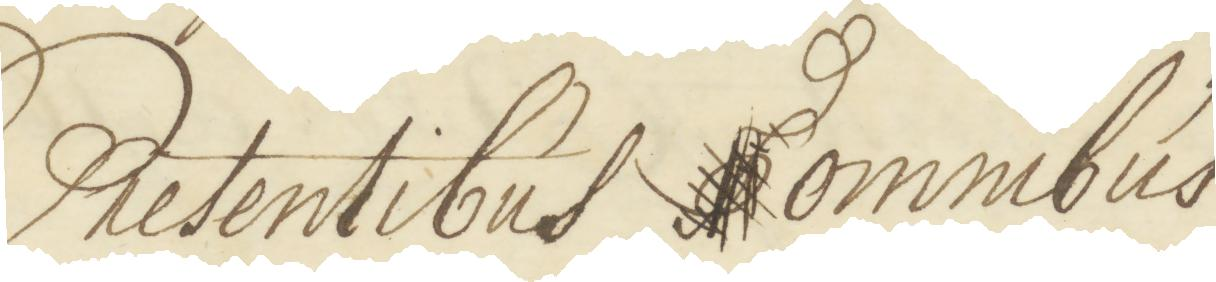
Presentibus o omnibus
